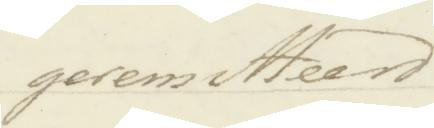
geremitteerd
